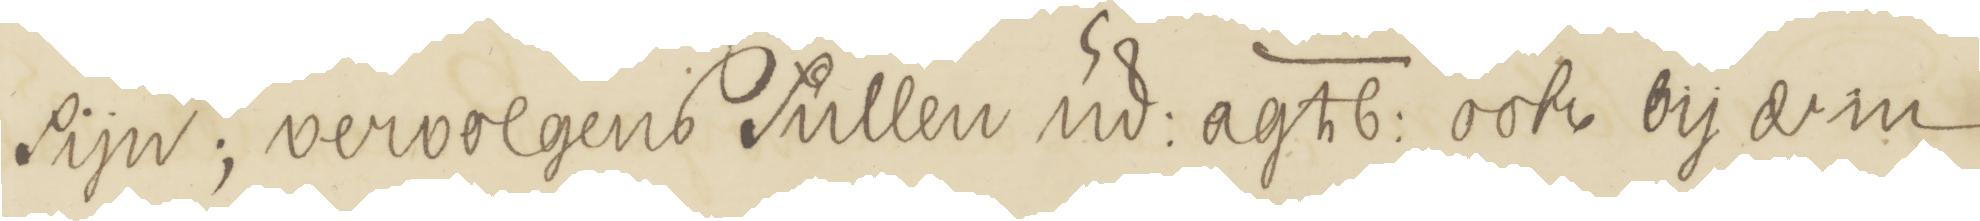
sijn; vervolgens sullen uE: agtb: ook bij de in
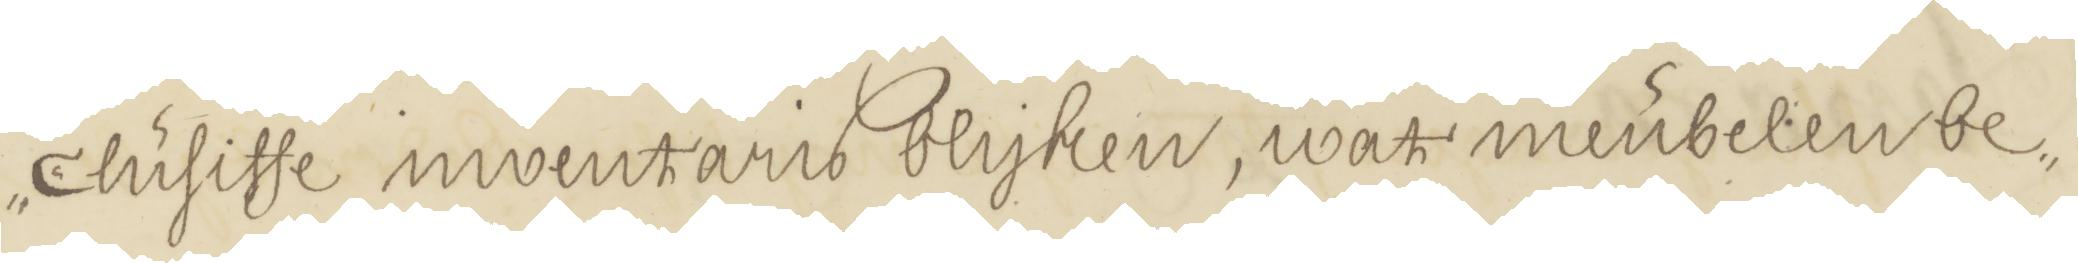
„clusiffe inventaris blijken, wat meubelen be„
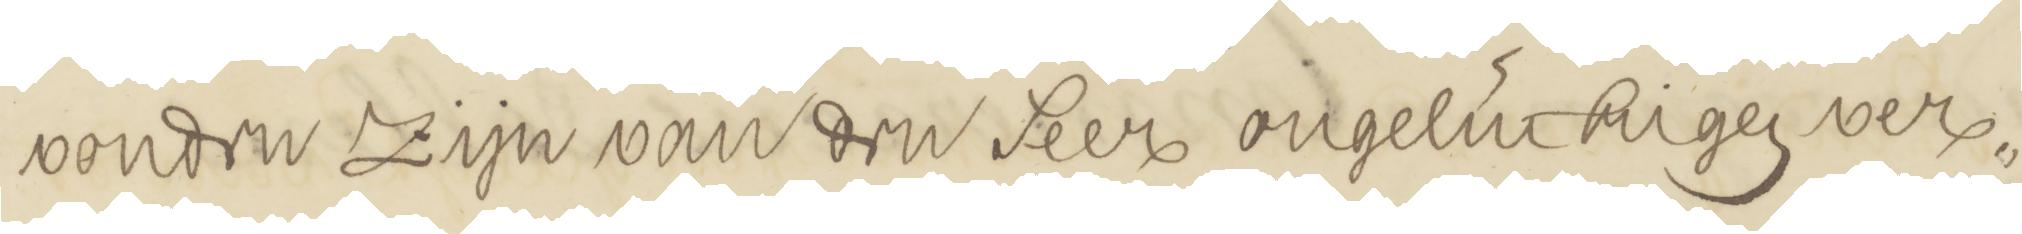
vonden zijn van den seer ongeluckigen ver„
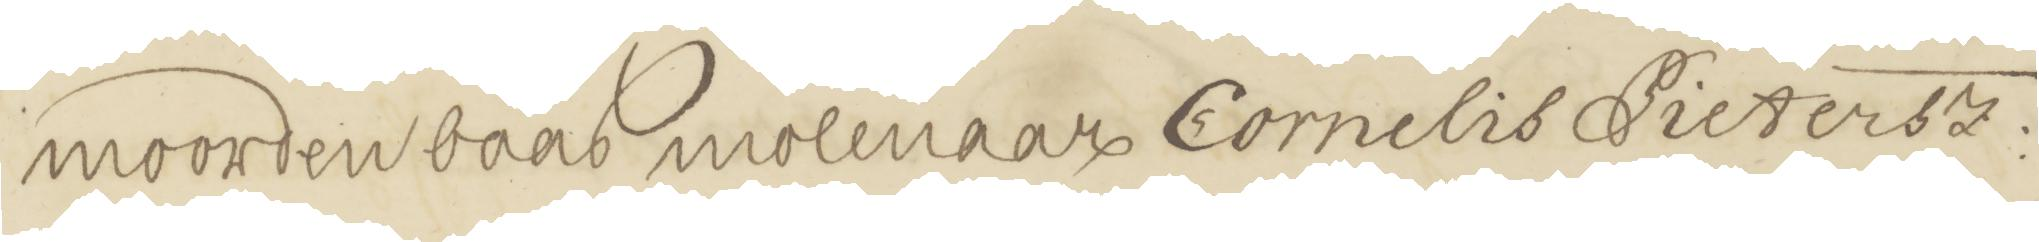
moorden baas molenaar Cornelis Pietersz
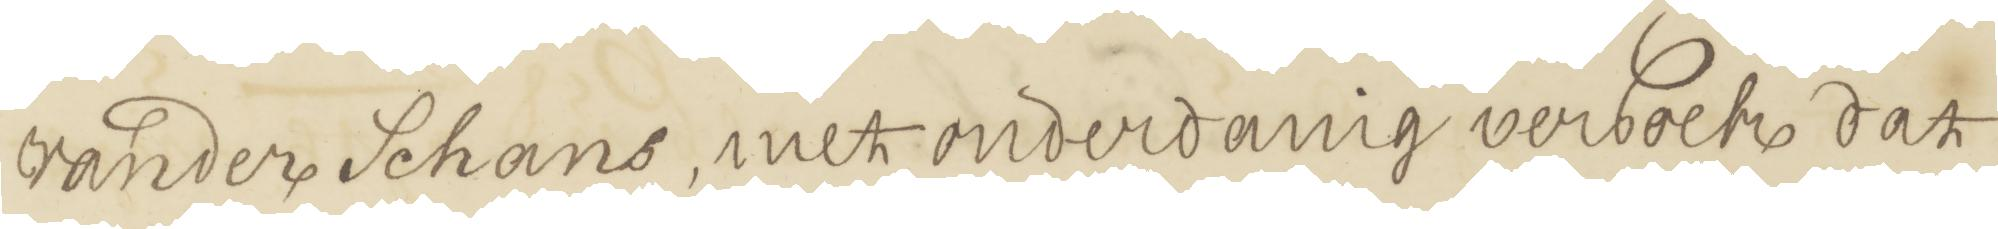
vander schans, met onderdanig versoek dat
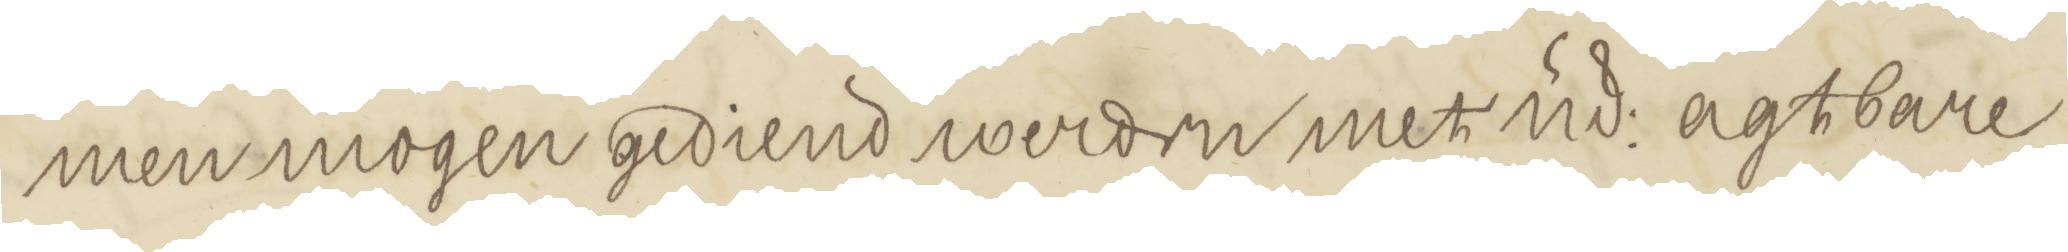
men mogen gediend werden met uE: agtbare
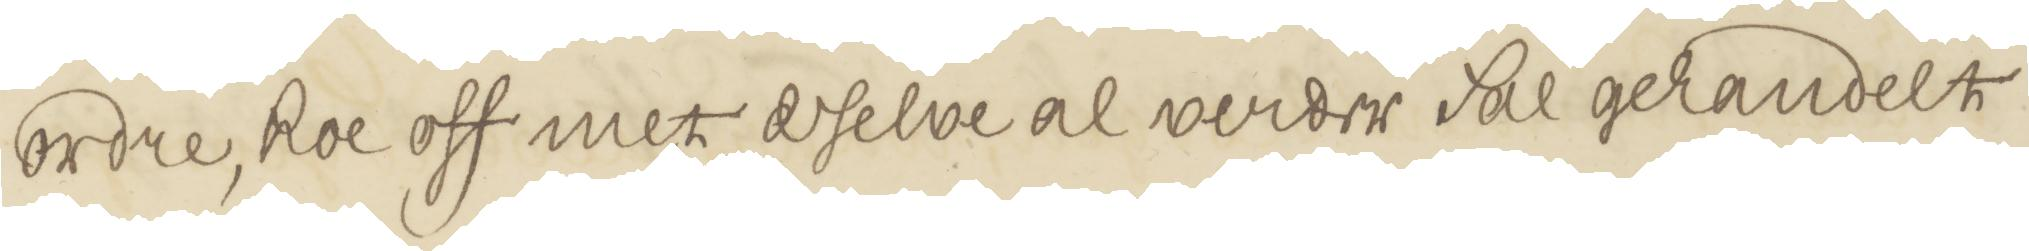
ordre, hoe off met deselve al verder sal gehandelt
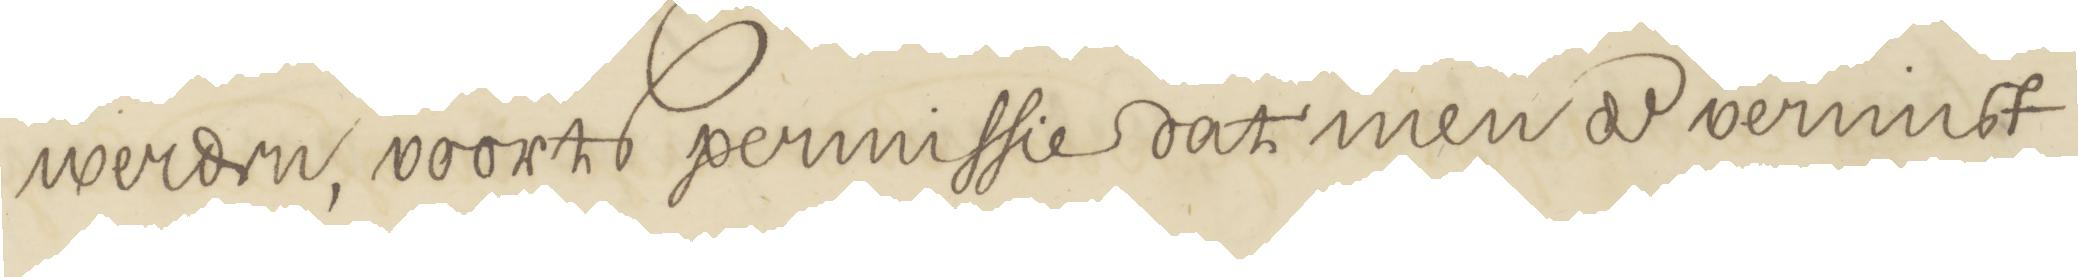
werden, voorts permissie dat men de vermist
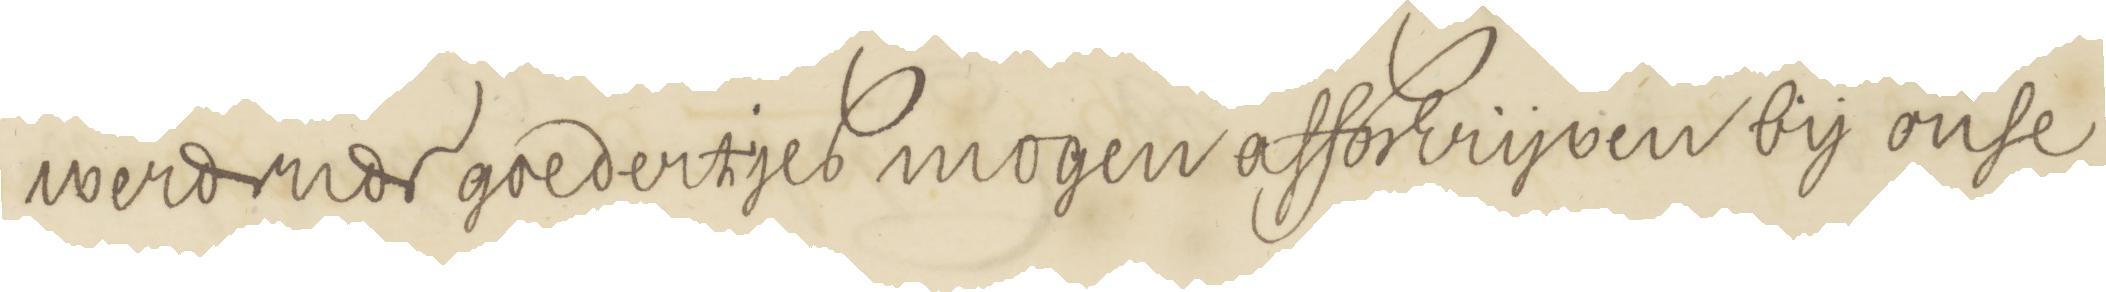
werdende goedertjes mogen affschrijven bij onse
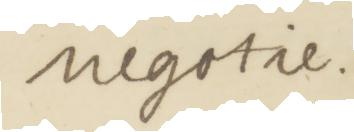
negotie
